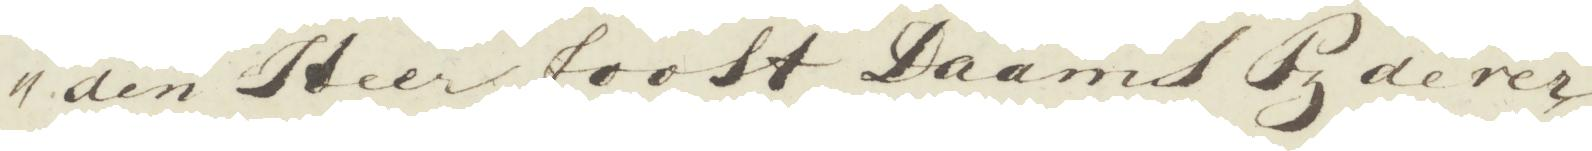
„den Heer Joost Daams Pz de ver
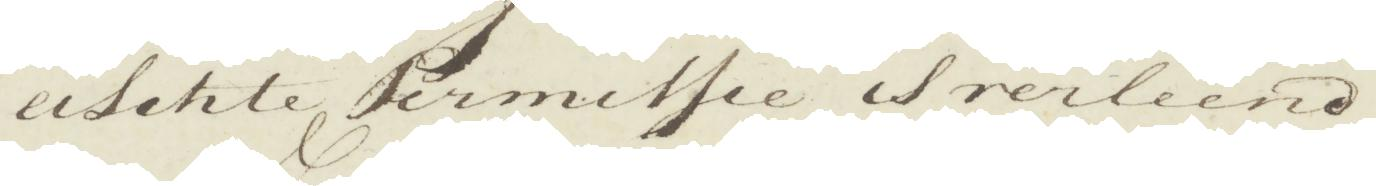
eischte Permissie is verleend
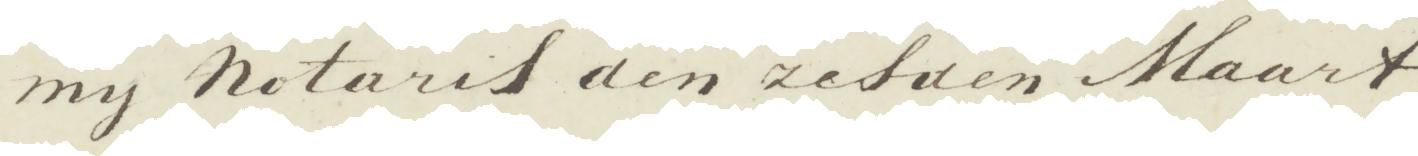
my Notaris den zesden Maart
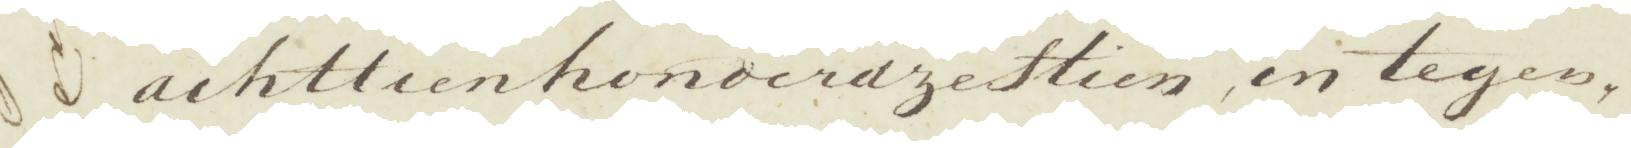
achttien honderd zestien, in tegen„
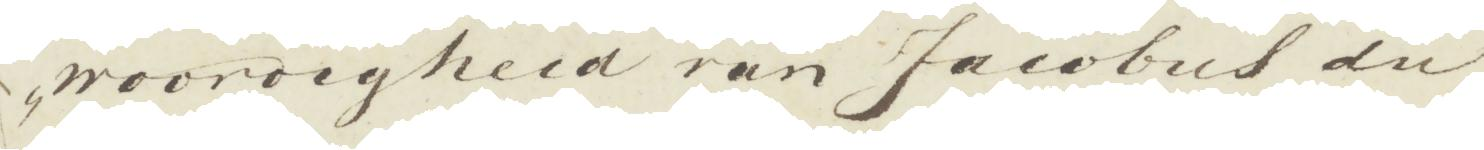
„woordigheid van Jacobus du
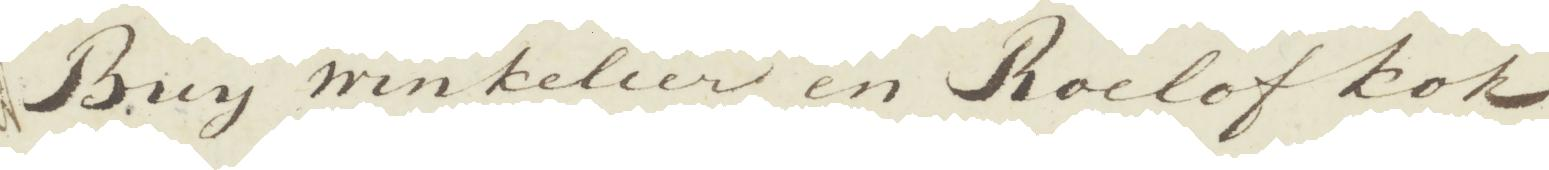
Buy winkelier en Roelof kok
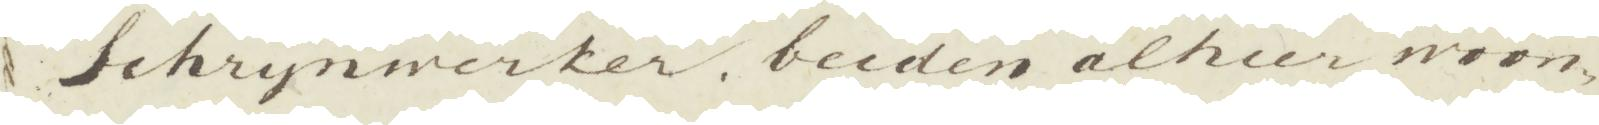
Schrynwerker, beiden alhier woon
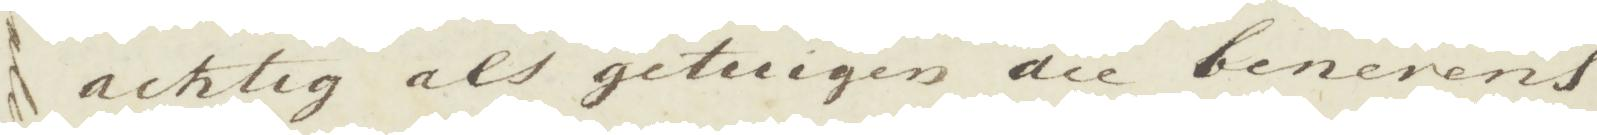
achtig als getuigen die benevens
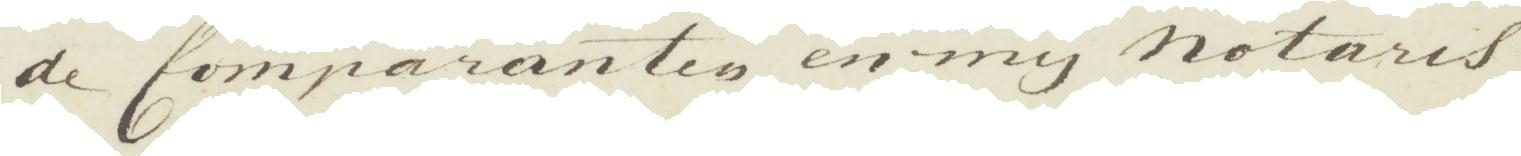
de Comparanten en my Notaris
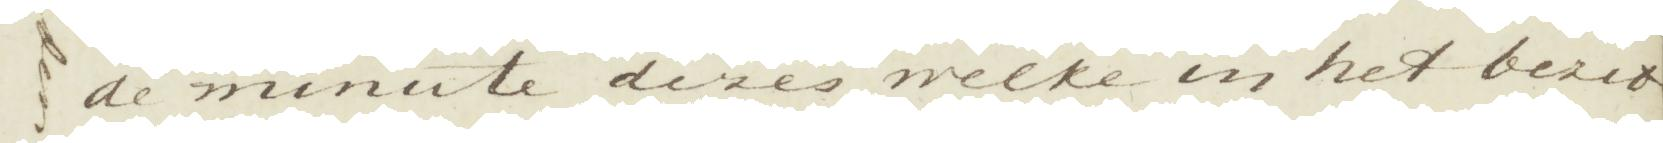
de minute dezes welke in het bezit
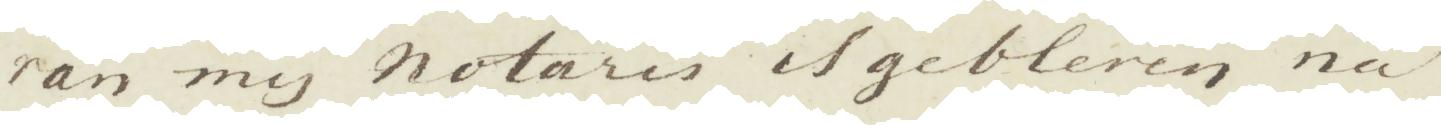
van my Notaris is gebleven na
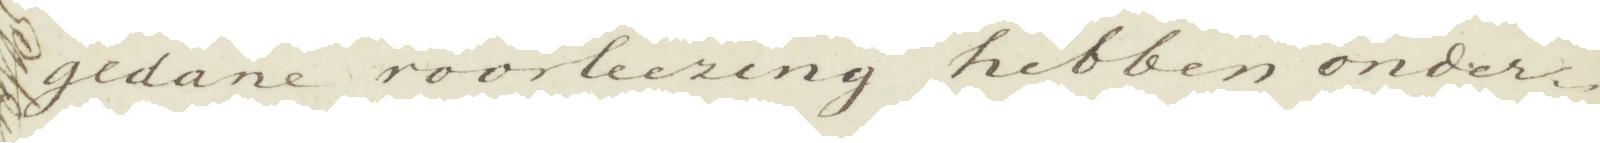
gedane voorleezing hebben onder
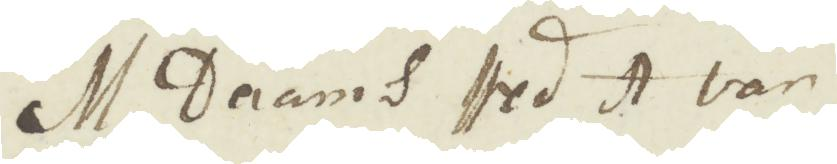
M Daams Wed A van
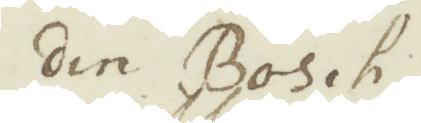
den Bosch
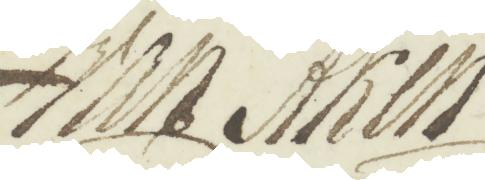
Van Aken
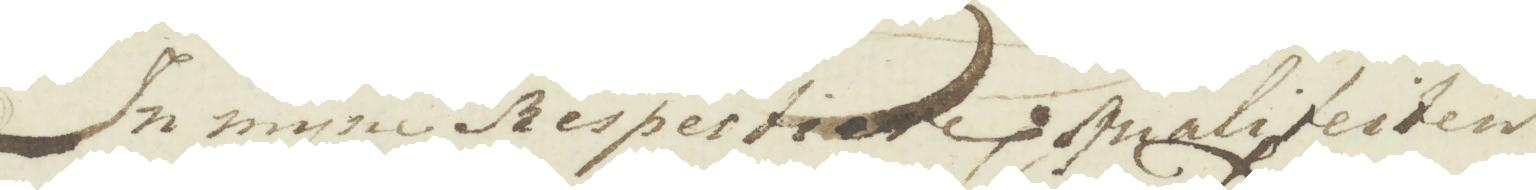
In myne Respectieve; qualiteiten
